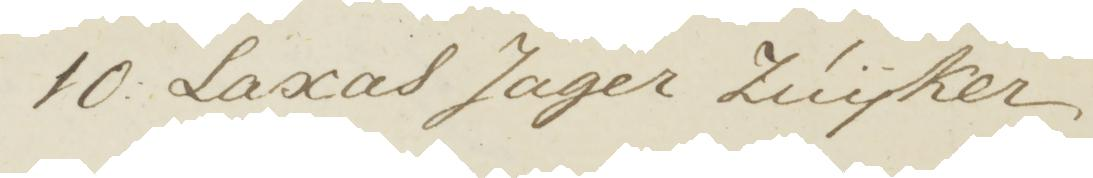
10: Laxas Jager zuijker
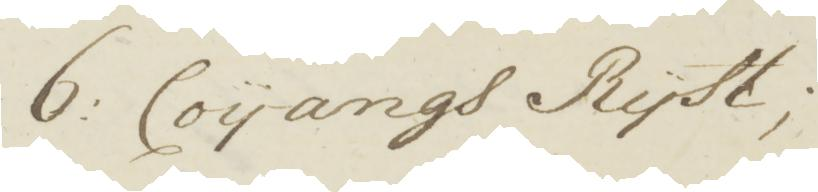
6: Coijangs Rijst;
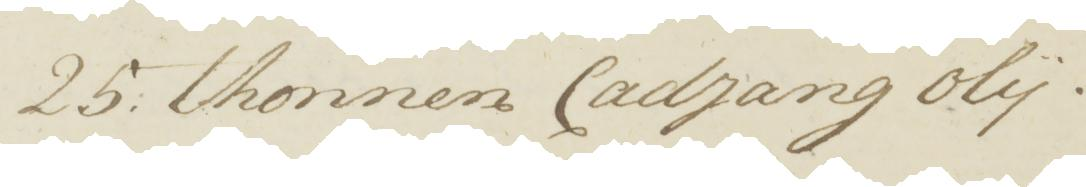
25: thonnen Cadjang olij.
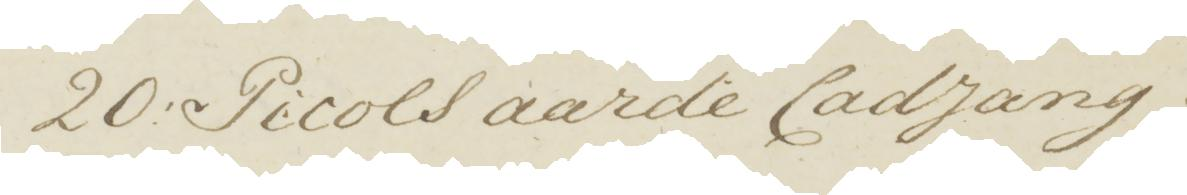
20: Picols aarde Cadjang
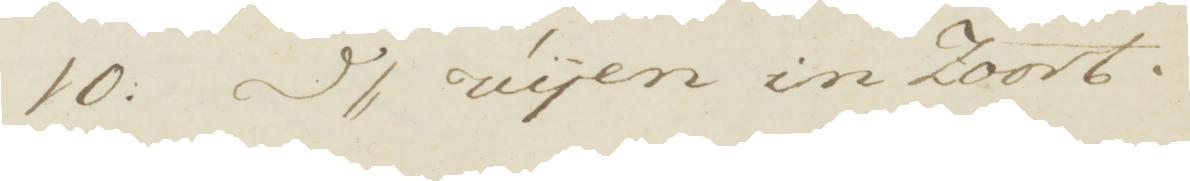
10: _„o uijen in zoort.
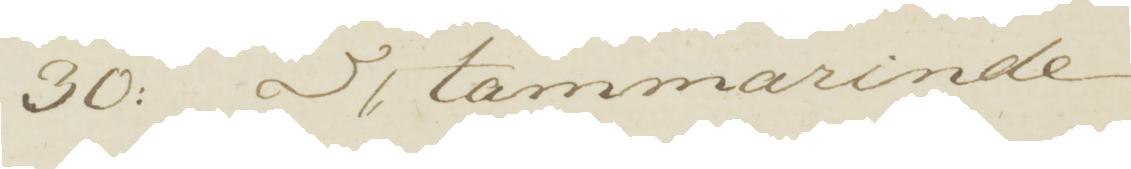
30: _„o tammarinde
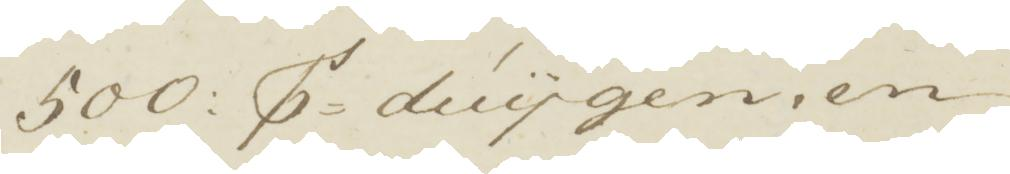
500: p=s duijgen, en
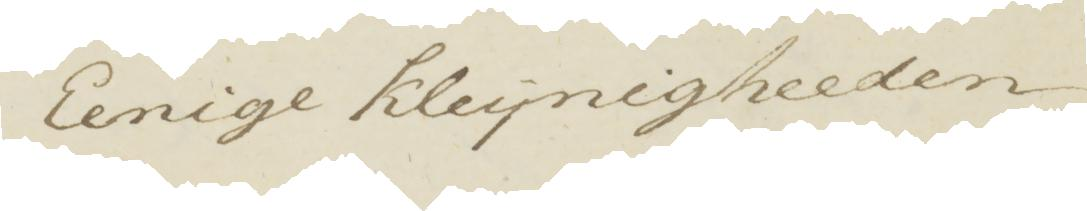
Eenige kleijnigheeden
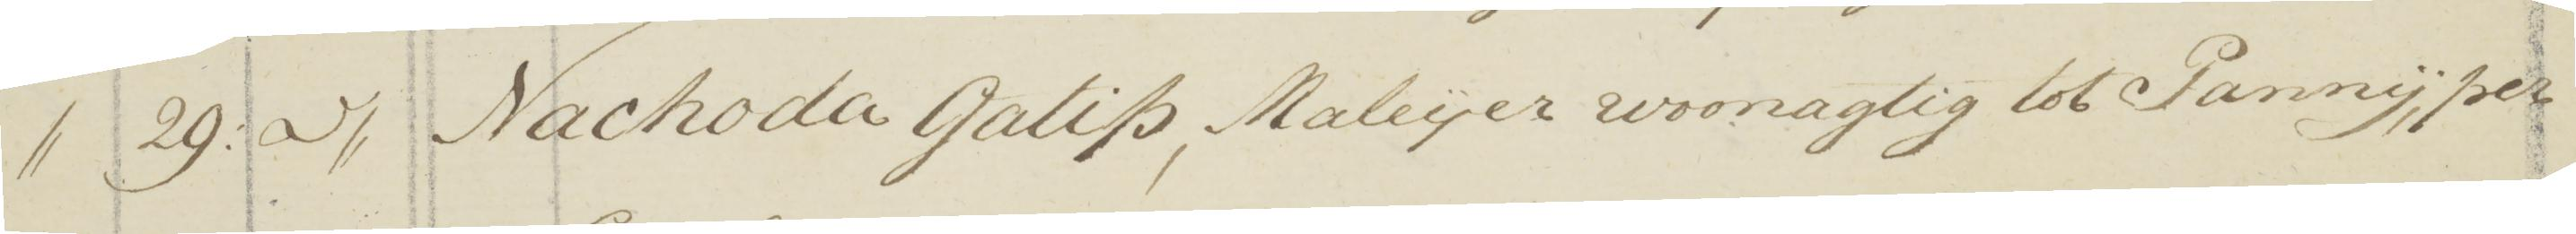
„ 29: _„o Nachoda Galip, Maleijer woonagtig tot Pannij, per
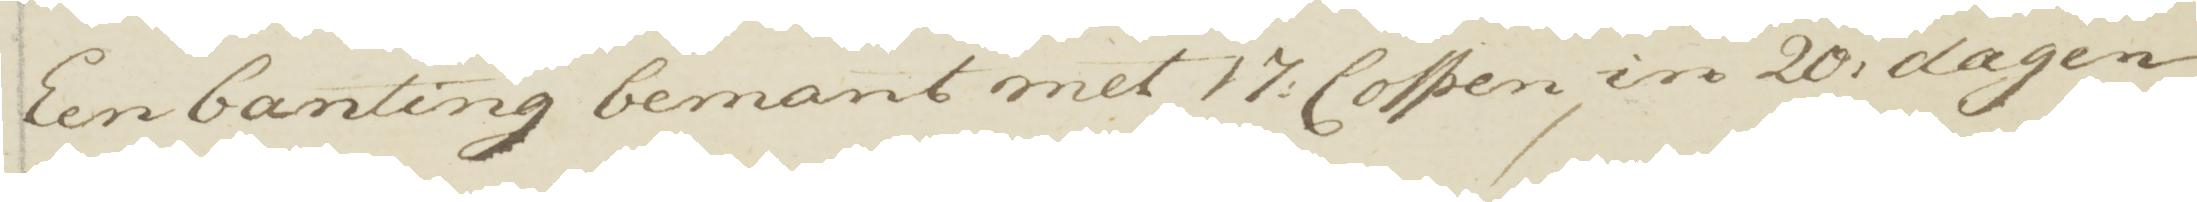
Een banting bemant met 17: Coppen, in 20: dagen
